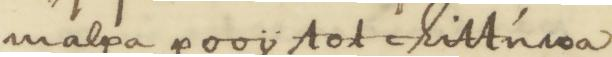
malpa pooij tot chittuwa
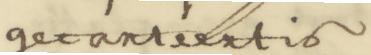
gecarteert is
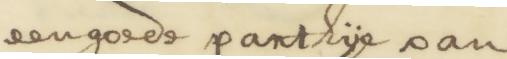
een goede parthije van
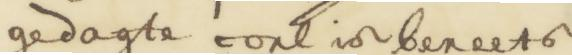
gedagte corl is bereets
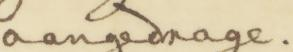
aangedrage.
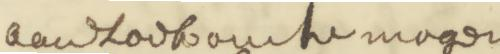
aanetoekomte moge
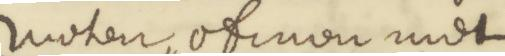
weten of men met
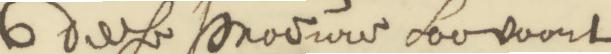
deese procure soo voort
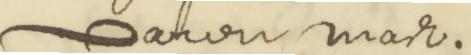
varen mach.
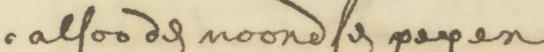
alsoo den noordsen peper
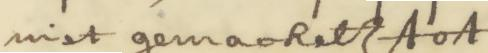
niet gemackelijk tot
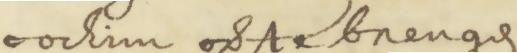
cochim overte brengen
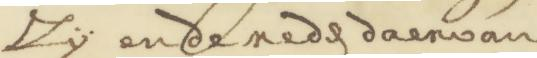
zij ende reden daervan
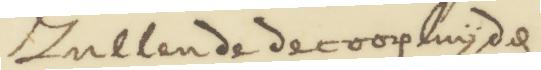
zullende de coopluijden
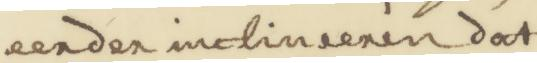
eerder inclineeren dat
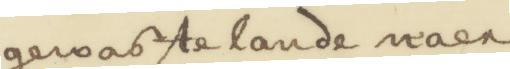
gewas te lande naer
